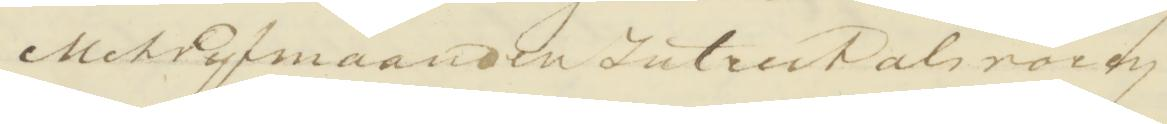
Met Vyf maanden Intrest als voren
